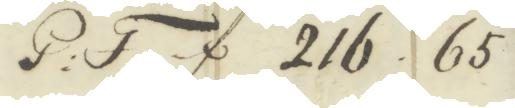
P: T ƒ 216 . 65
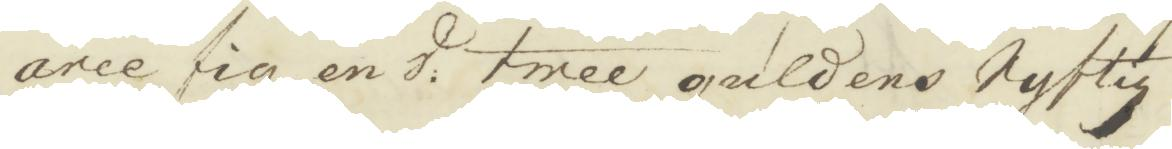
avec fig en v: twee guldens vyftig
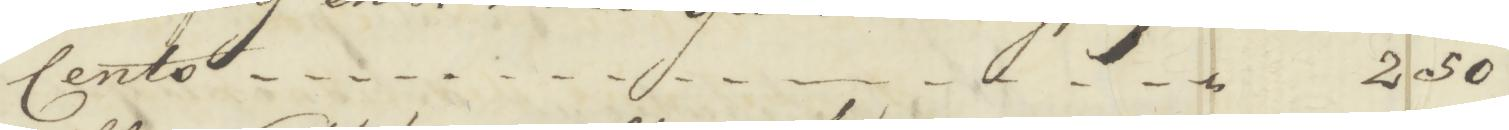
cents - - - - - - - - - - - - - - - - „ 250
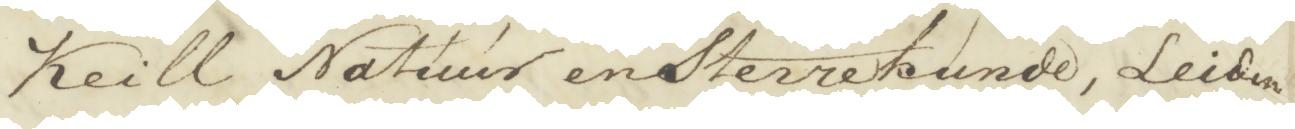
Keill Natuur en Sterrekunde, Leiden
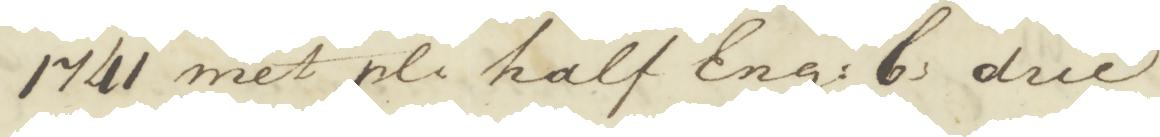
1741 met pl. half Eng: b: drie
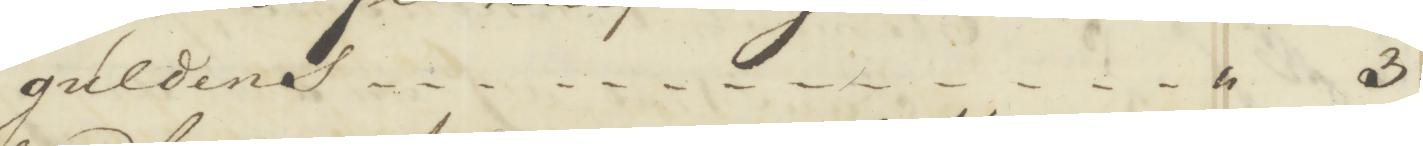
guldens - - - - - - - - - - - - - - „ 3
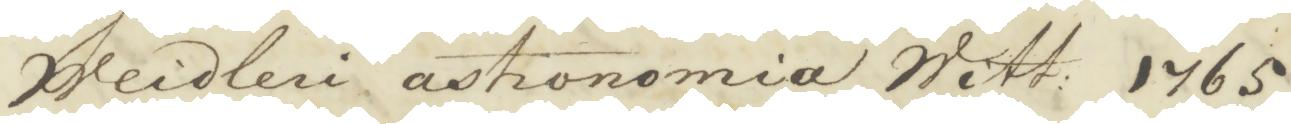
Weidleri astronomia Witt: 1765
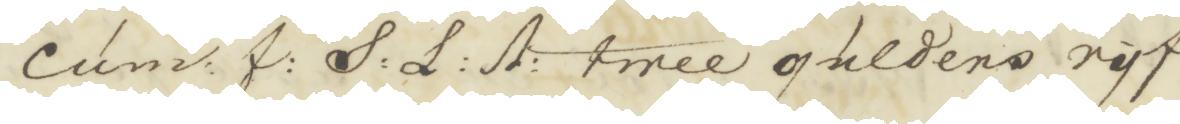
Cum: f: S: L: A: twee guldens vijf
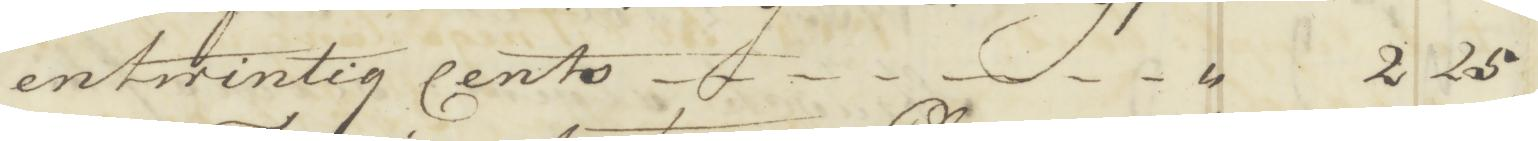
entwintig cents - - - - - - - - „ 2 25
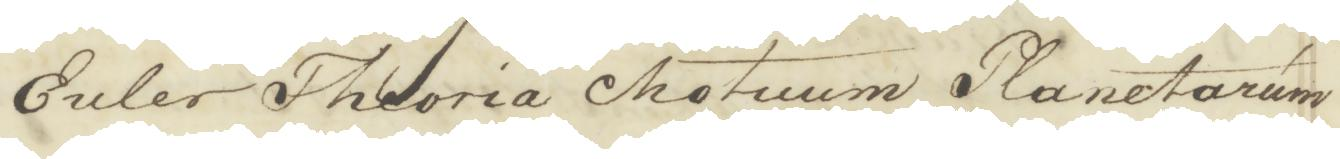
Euler Theoria Motuum Planetarum
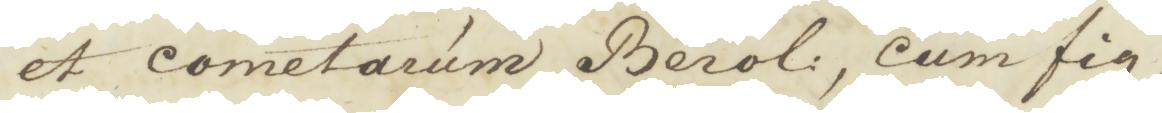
et cometarum, Berol:, cum fig
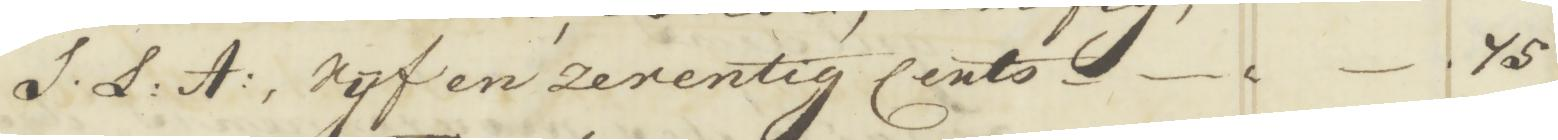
S: L: A:, vijf en zeventig Cents 75
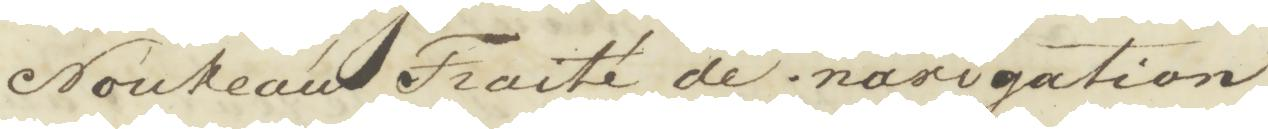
Nouveau Fraité de navigation
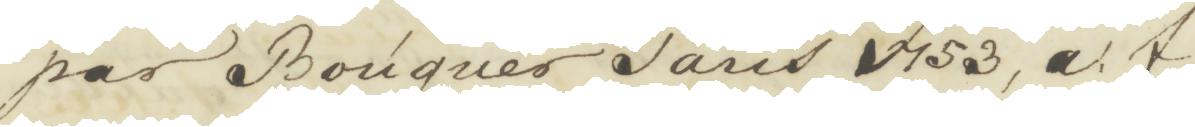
par Bougues Paris 1753, a: f
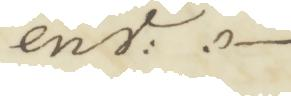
env:
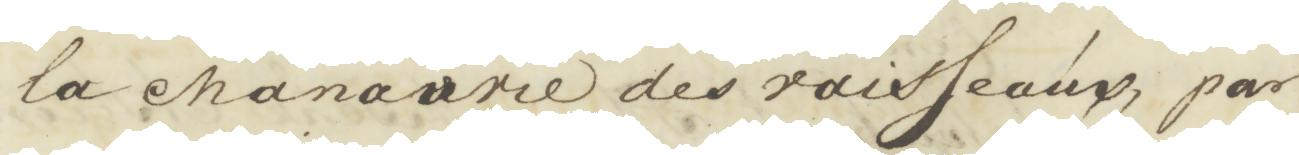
la Manauvie des vaisseaux, par
